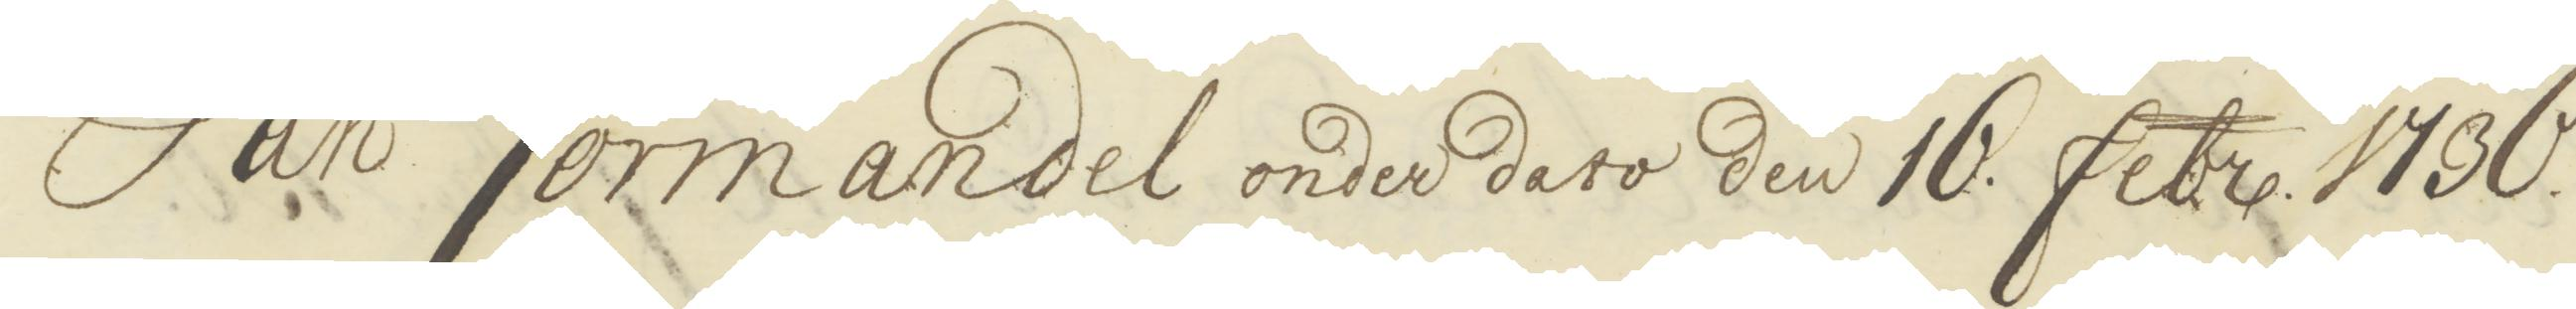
Van Cormandel onder dato den 16. febr. 1736.
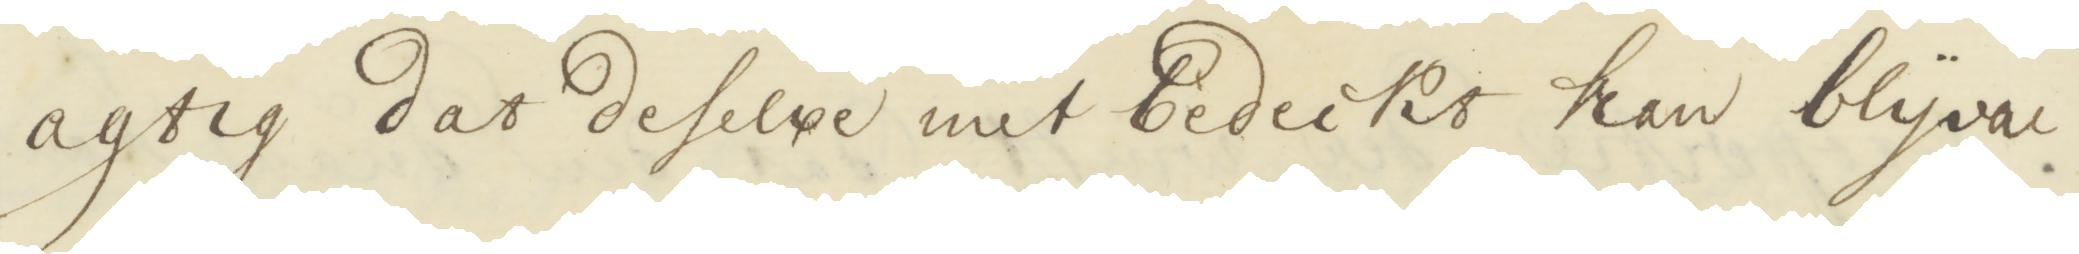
agtig dat deselve niet bedeckt kan blijven
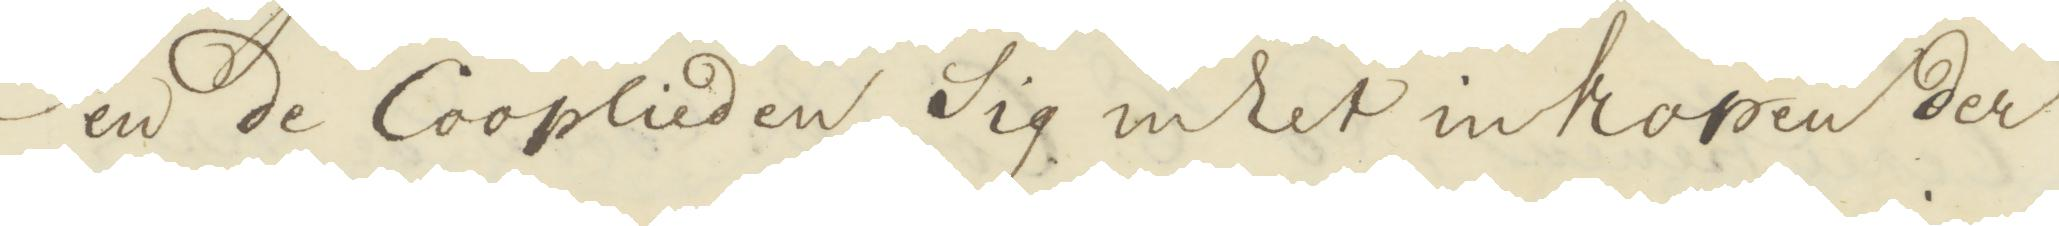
en de Cooplieden Sig in het inkopen der
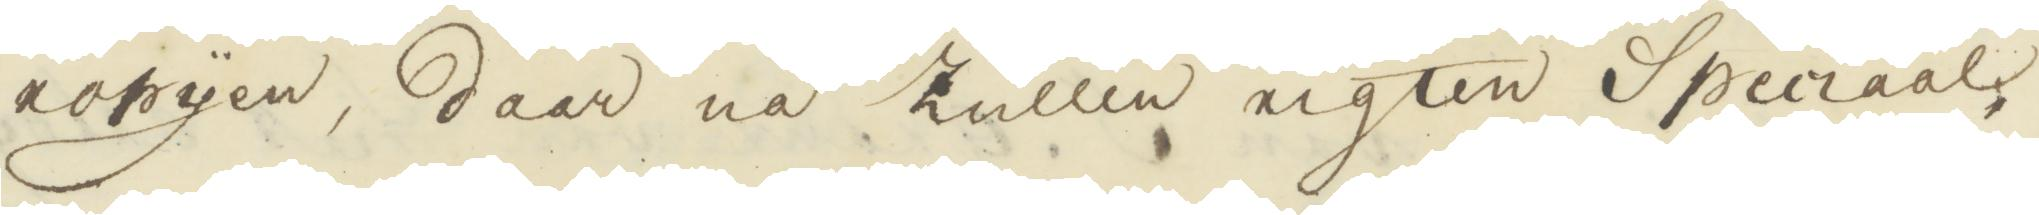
ropijen, daar na Zullen rigten Speciaal„
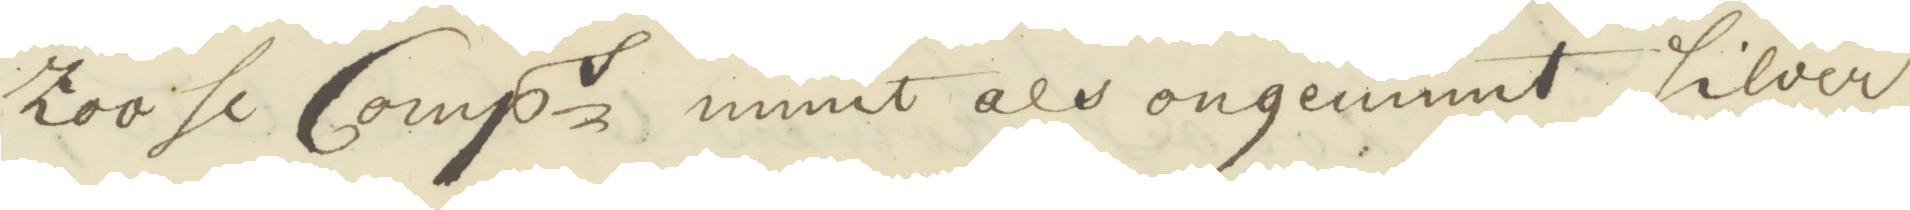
Zoo se Comp=s munt als ongemunt Silver
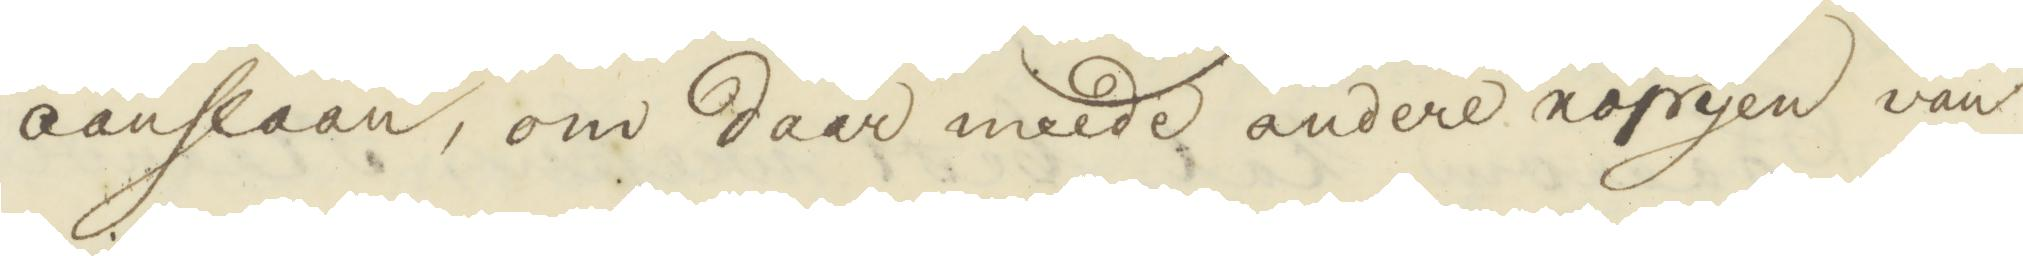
aanslaan, om daar meede andere ropijen van
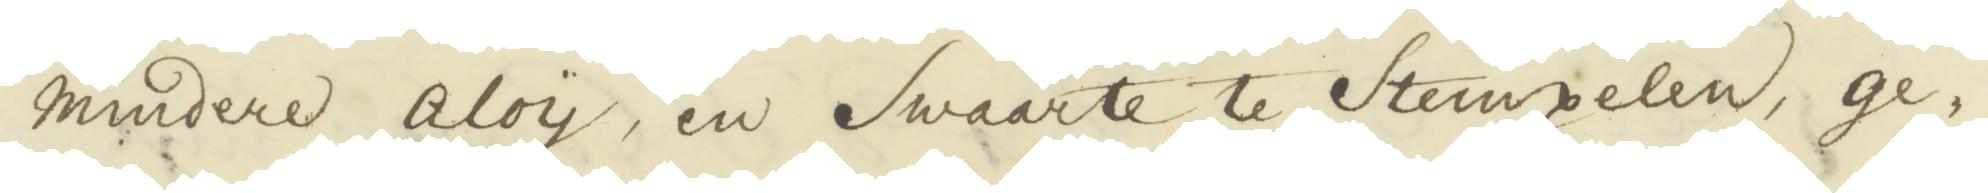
mindere aloij, en Swaarte te Stempelen, ge„
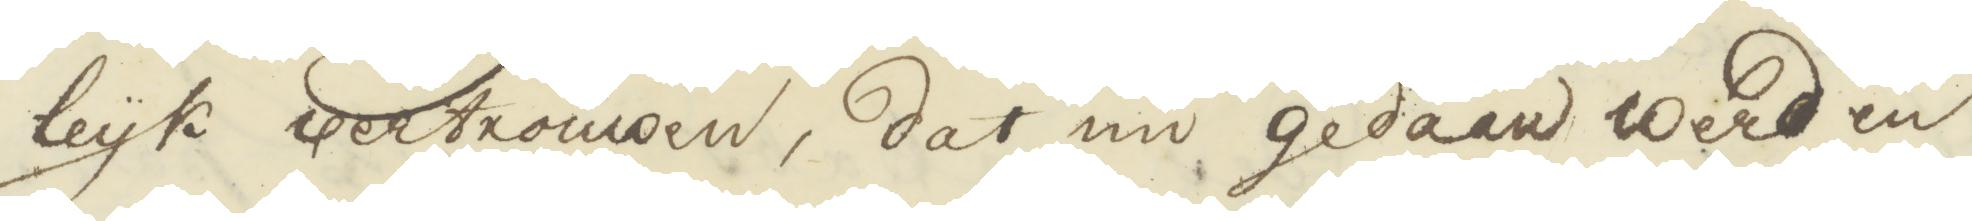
leijk vertrouwen, dat nu gedaan werden
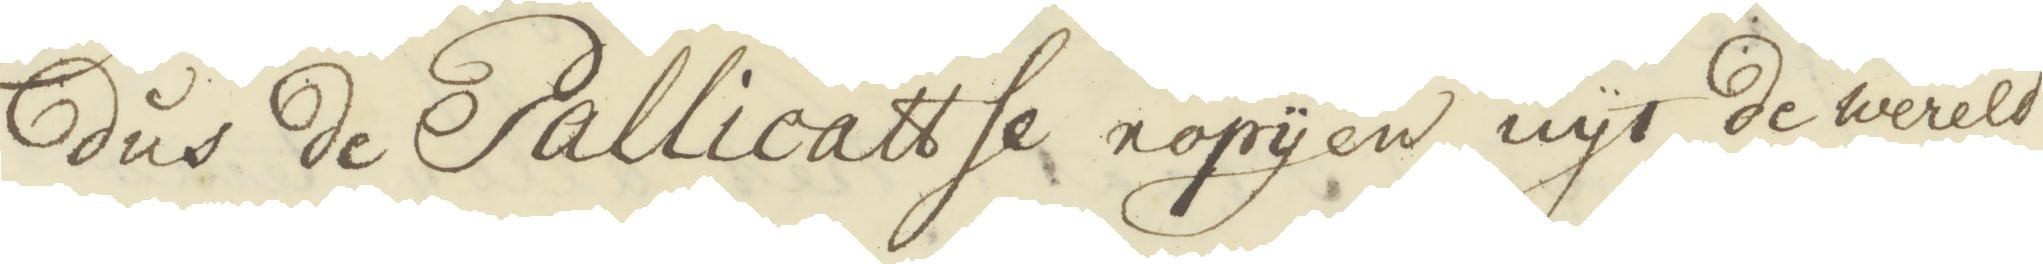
dus de Pallicattse ropijen uijt de wereld
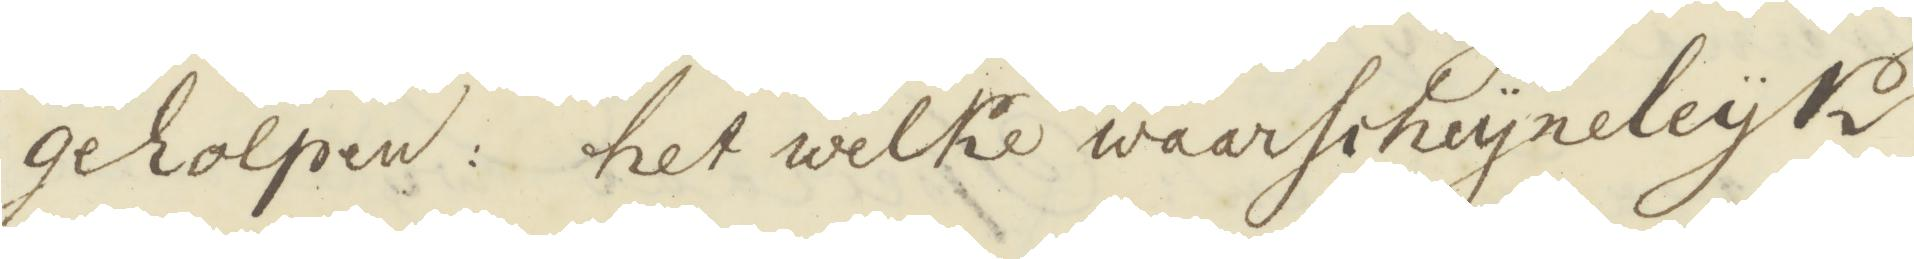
geholpen: het welke waarscheijneleijk
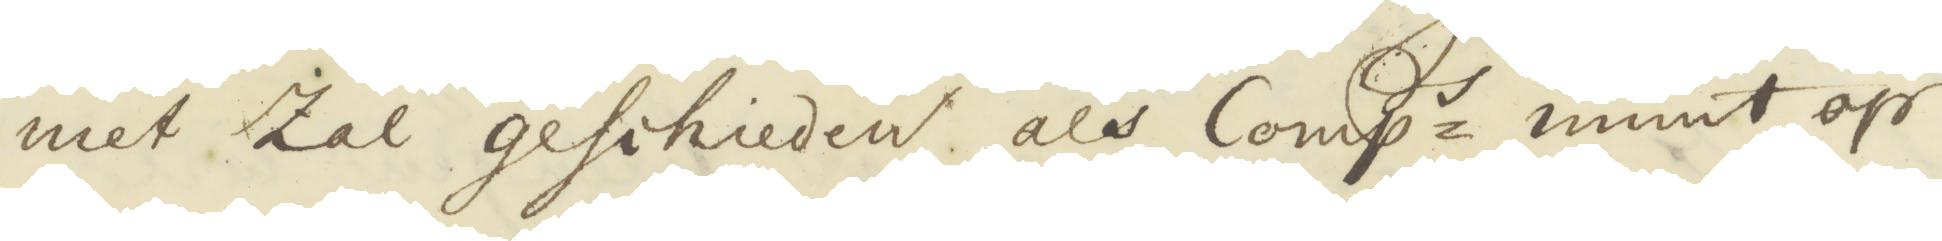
niet Zal geschieden als Comp=s munt op
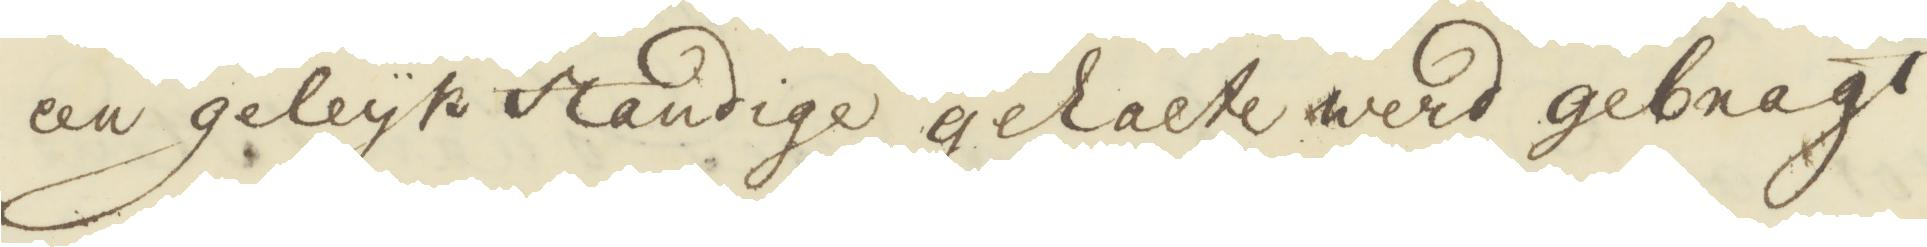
een geleijk standige gehalte werd gebragt
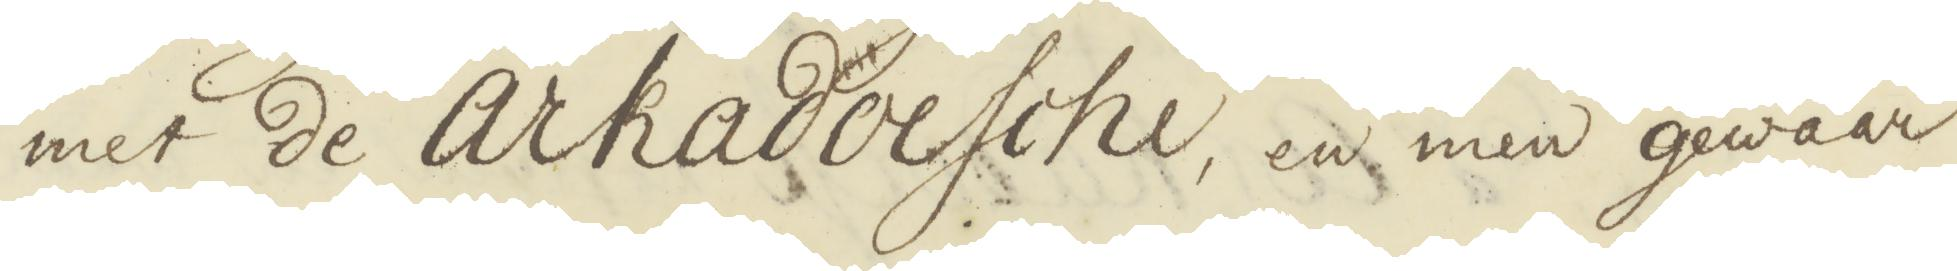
met de Arkadoesche, en men gewaar
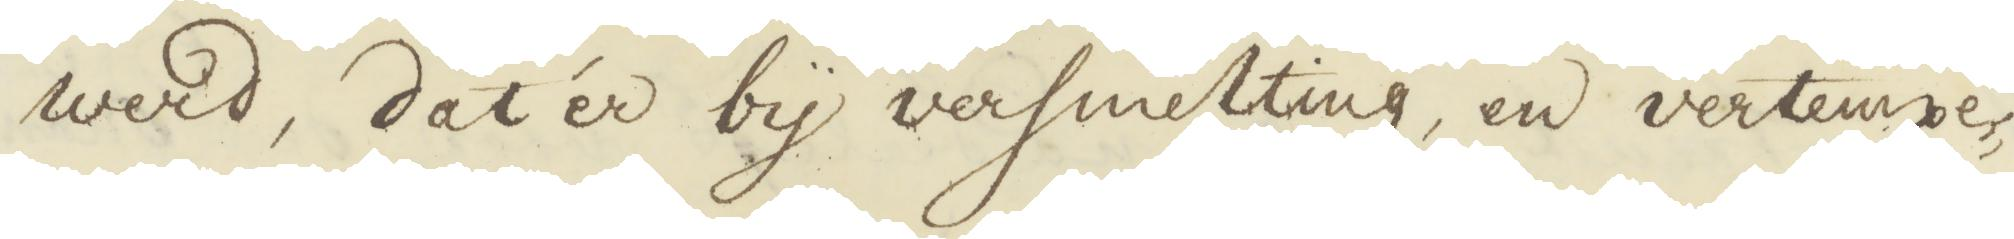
werd, dat 'er bij versmelting, en vertempe„
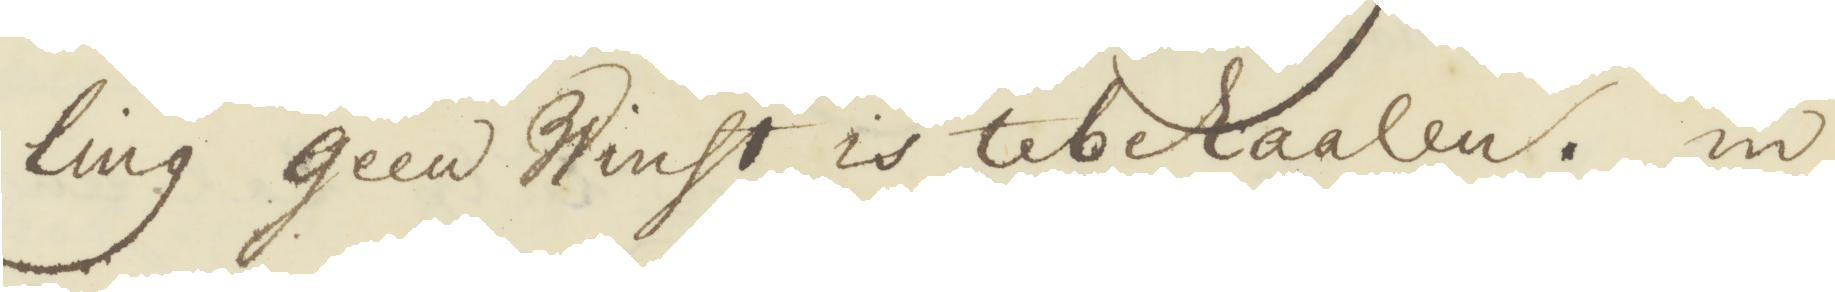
ling geen winst is te behaalen. in
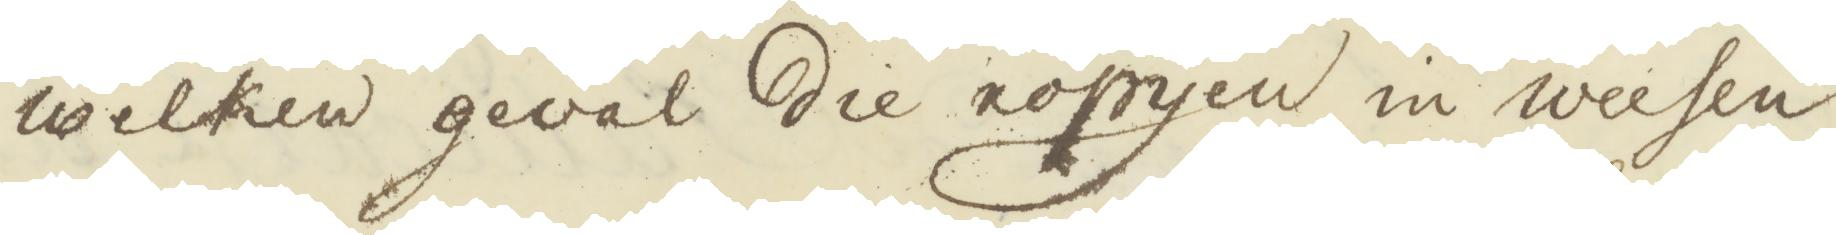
welken geval die ropijen in weesen
